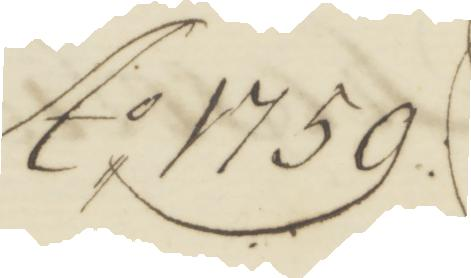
A: 1759:
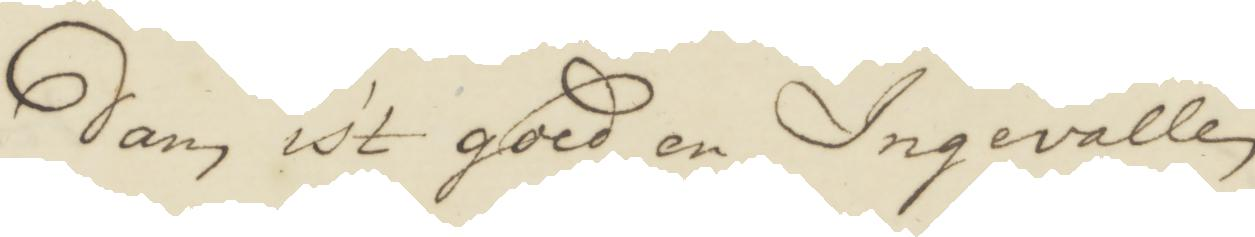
dan is't goed en Ingevallen
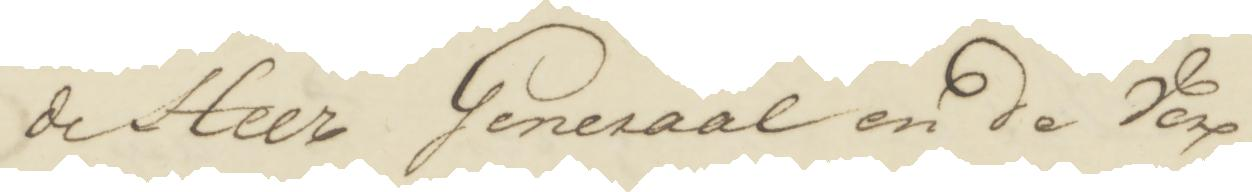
de Heer Generaal en de Ver
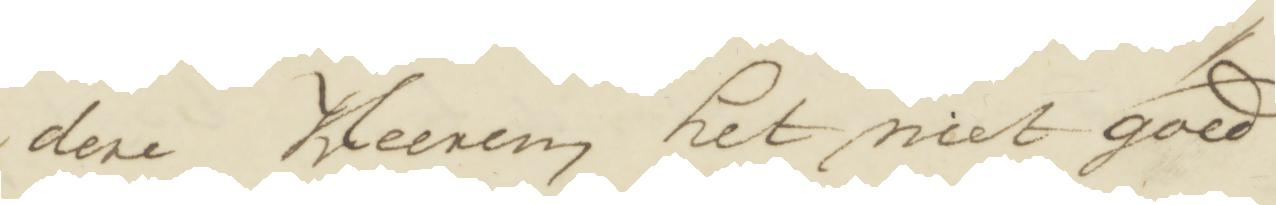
„dere Heeren het niet goed
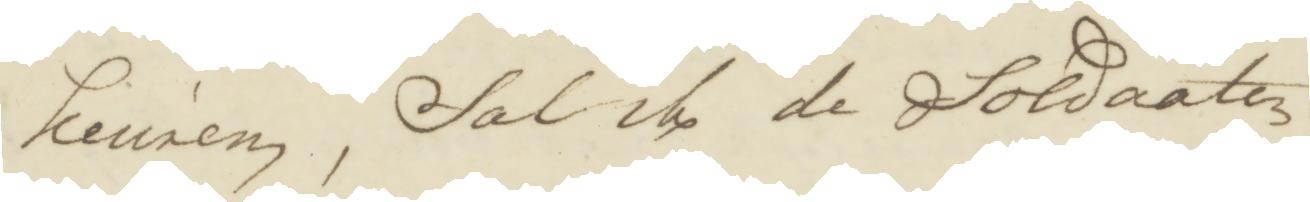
keuren, Sal ik de Soldaaten
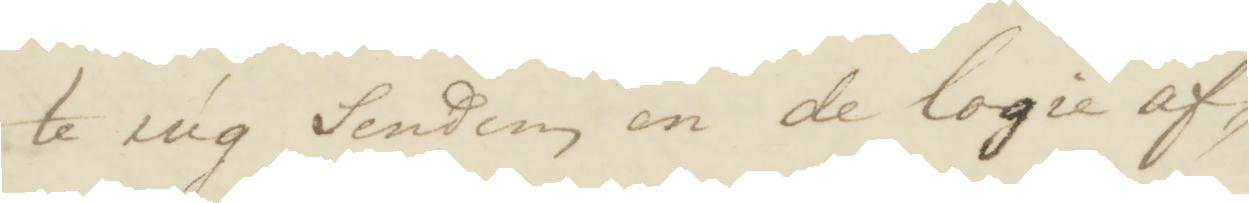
te rug Senden en de logie af„
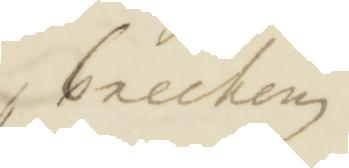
„breeken
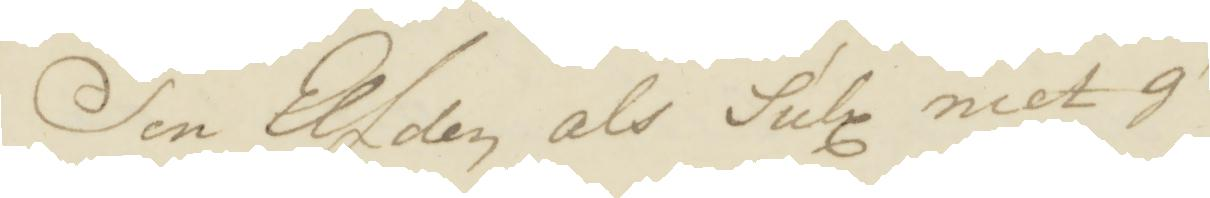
Ten Elfden als sulx niet g’
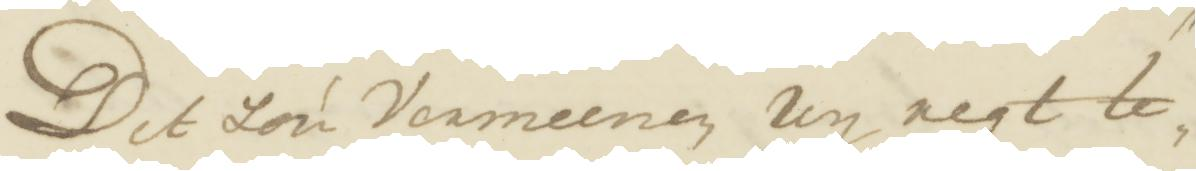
Dit zou vermeenen wy regt te„
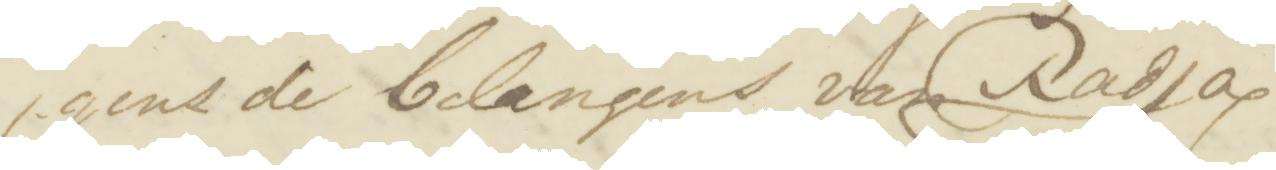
„gens de belangens van Radja
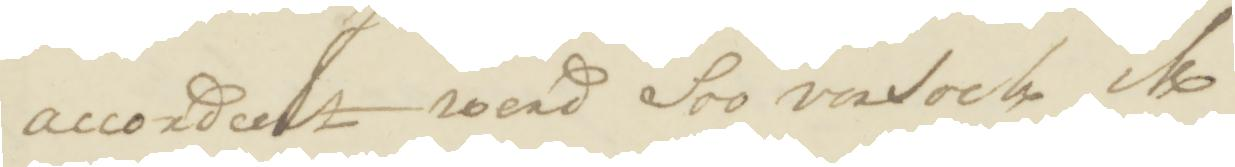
accordeert werd Soo versoek ik
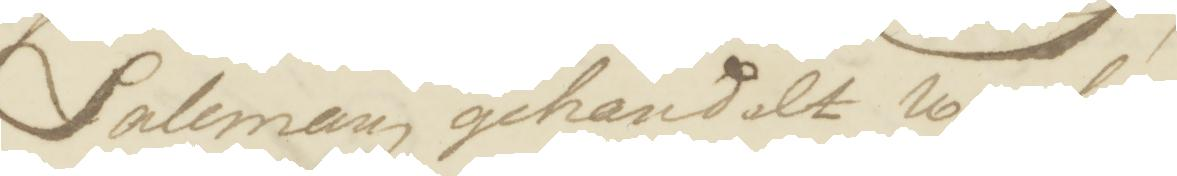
Saleman gehandelt weesen
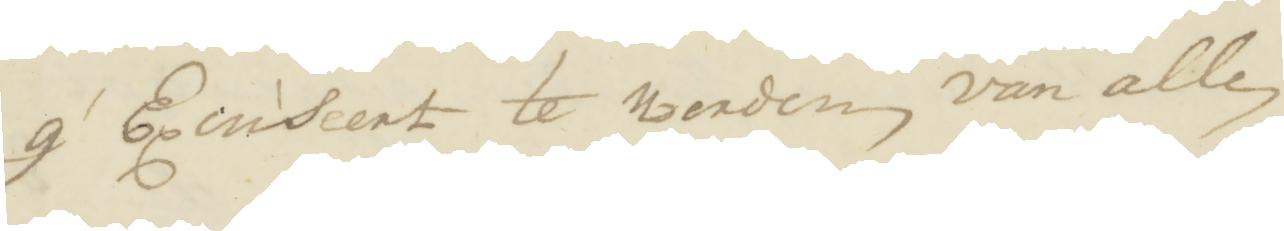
g’ Excuseert te werden van alle
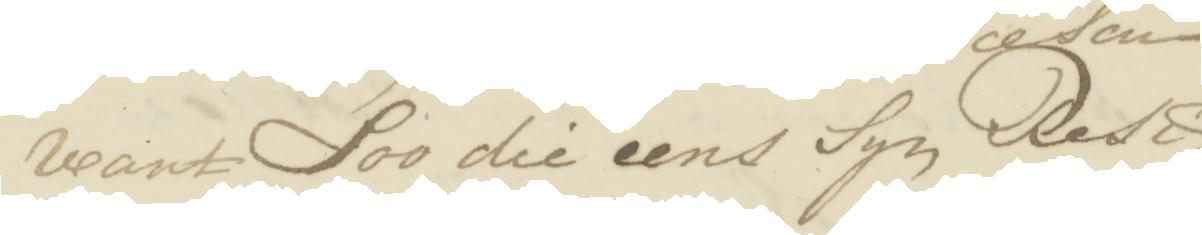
want Soo die eens Syn Resi:
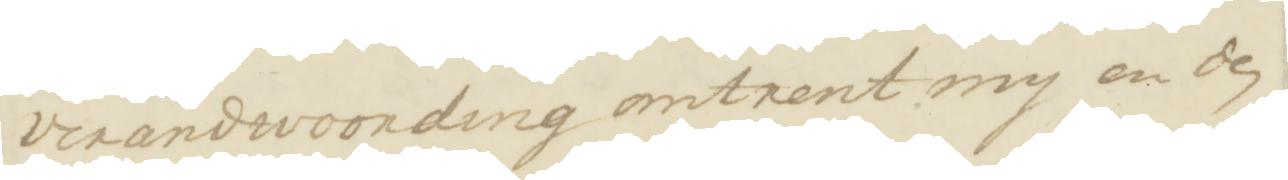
verandwoording omtrent my en den
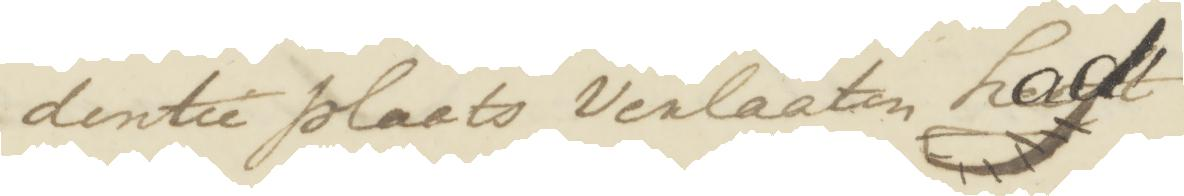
,dentie plaats verlaaten had
